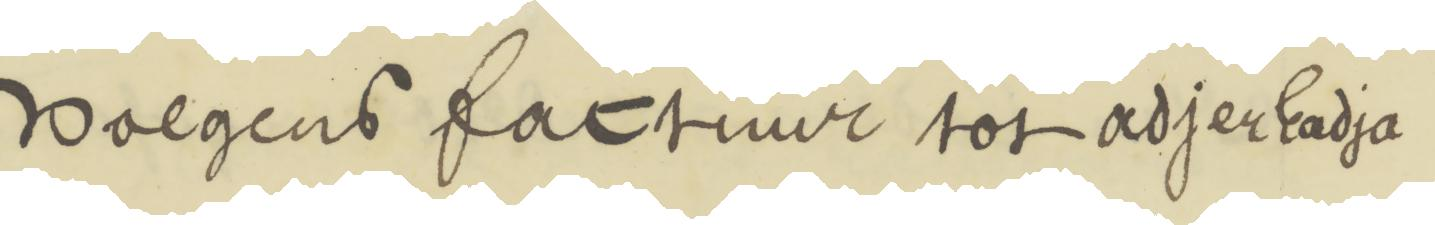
volgens factuur tot adjerhadja
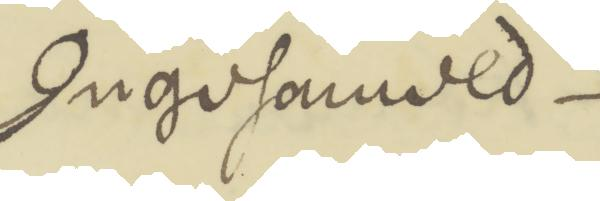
Jngesameld —
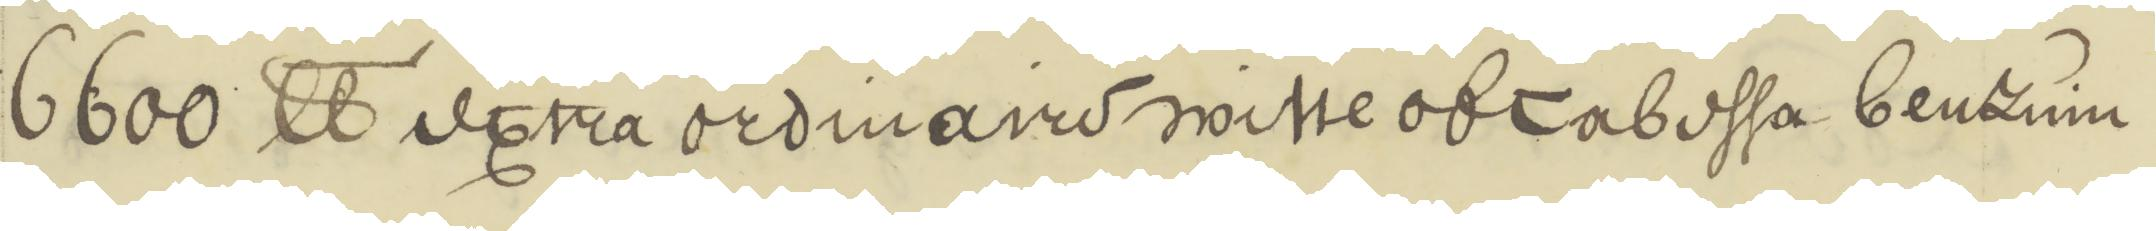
6600 lb extra ordinaire witte of cabessa benzuin
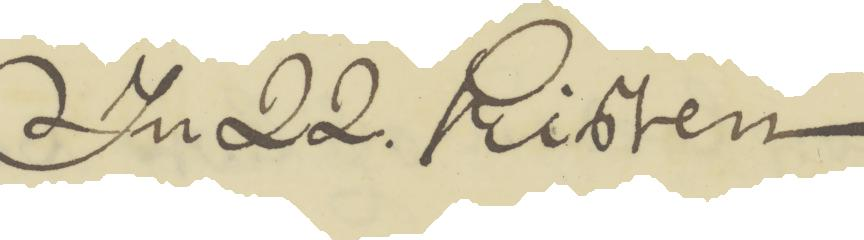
In 22. kisten
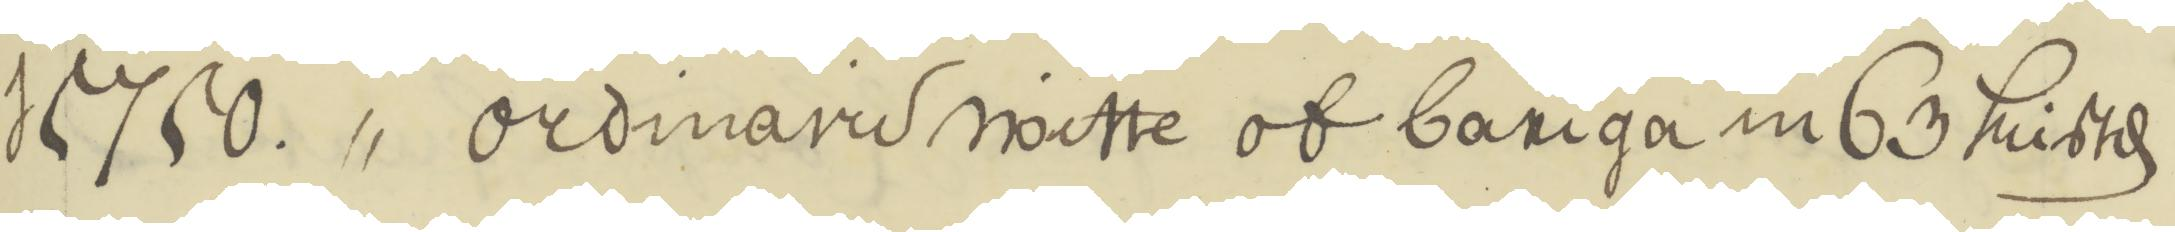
15750. „ ordinaire witte of bariga in 63 kisten
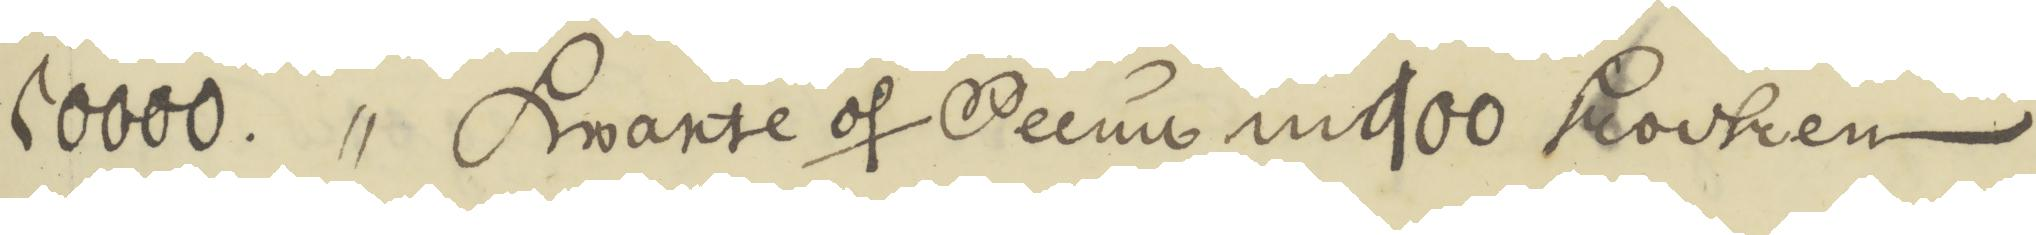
50000. „ Swarte of Peeuw in 400 koeken
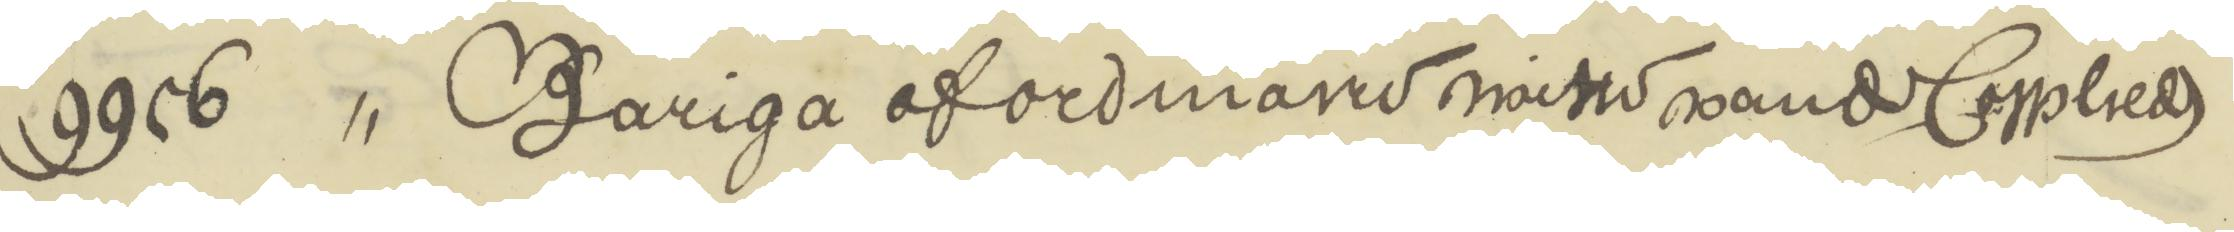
9956 „ Bariga of ordinaire witte van de Copplieden
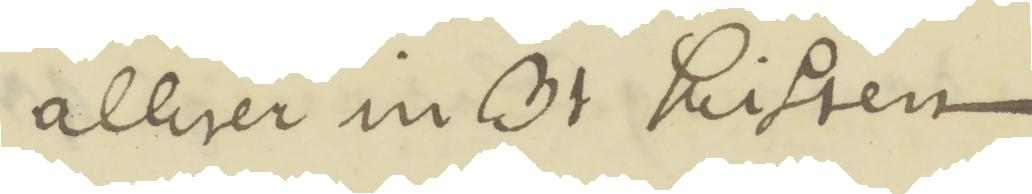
alhier in 31 kisten
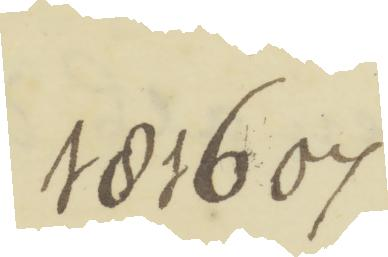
181607
